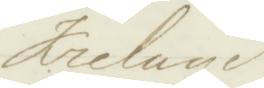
Krelage
